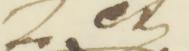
P:et
